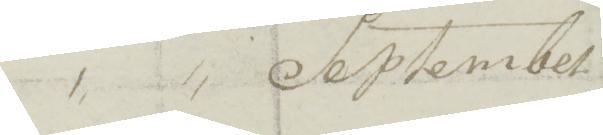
„ „ September
